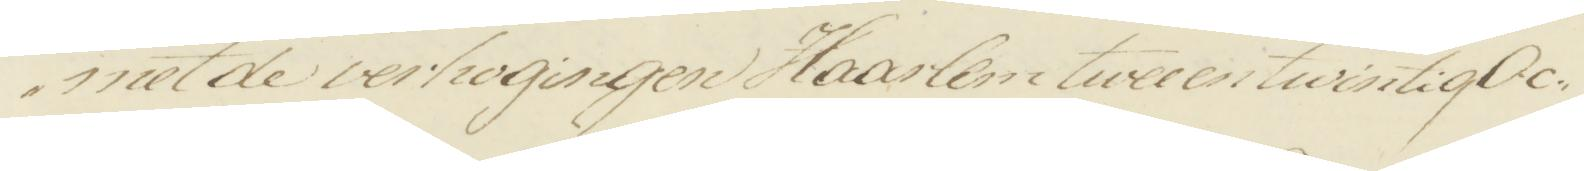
„ met de verhogingen Haarlem twee en twintig Oc„
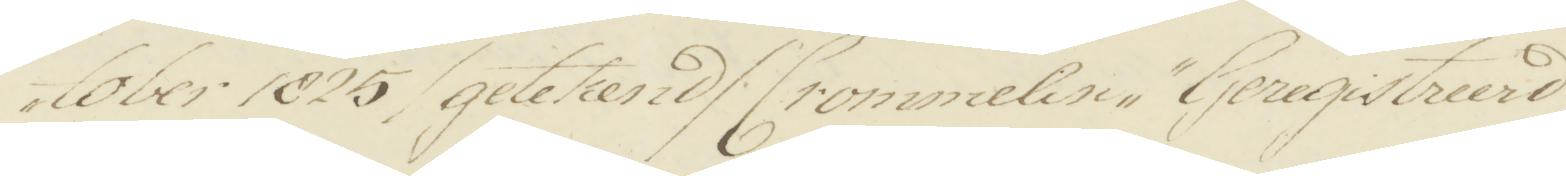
„ tober 1825 /getekend/ Crommelin„ "Geregistreerd
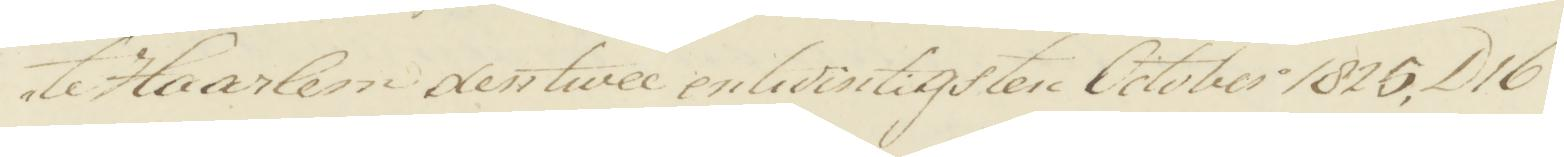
„ te Haarlem den twee en twintigsten October 1825, D16
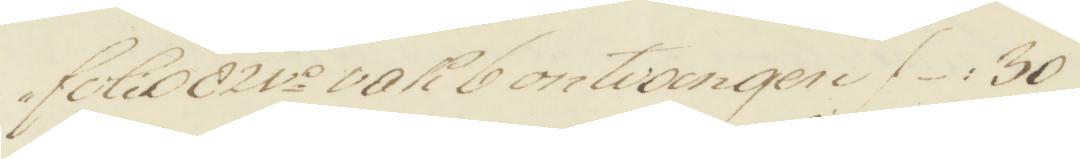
„ folio 82 v=o vak 6 ontvangen ƒ – : 30
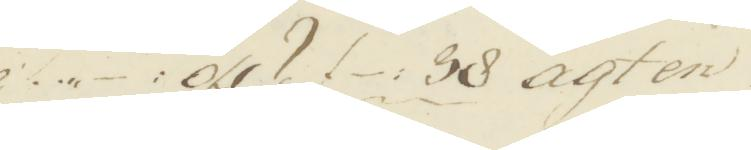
13 . . „ – : 04 ƒ – : 38 agt en
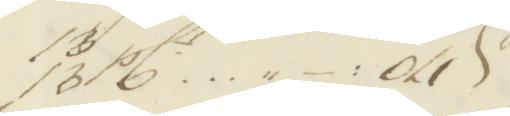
13 pC.t . . . „ – : 04
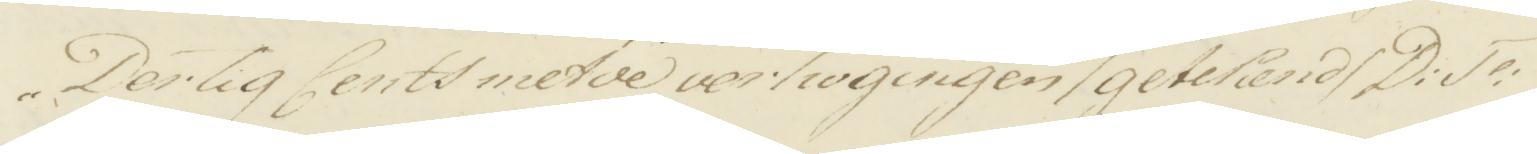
„ Dertig Cents met de verhogingen /getekend/ D: F:
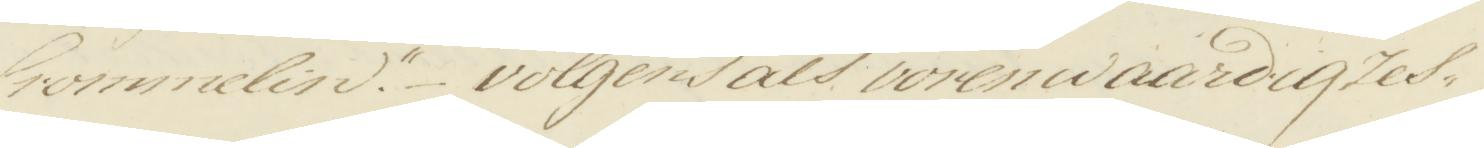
Crommelin" – volgens als voren waardig zes„
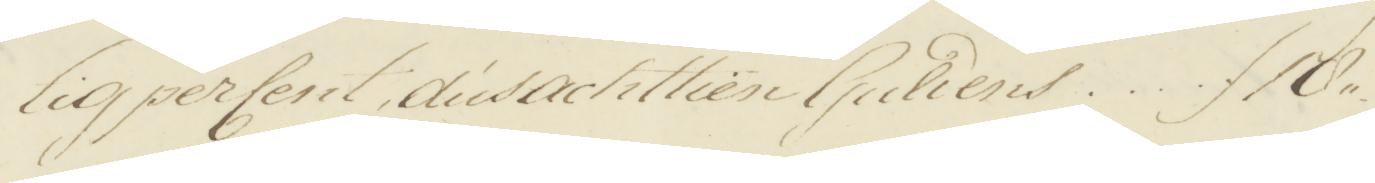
tig percent, dus achttien Guldens . . . . ƒ18„ —
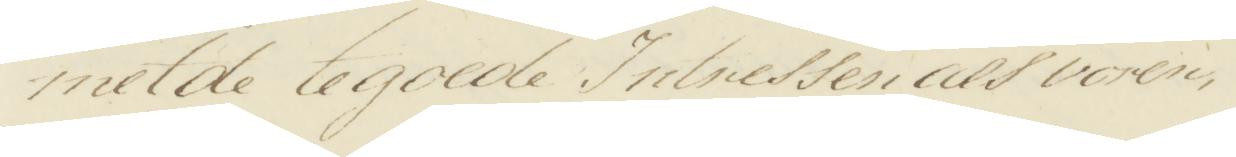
met de tegoede Intressen als voren,
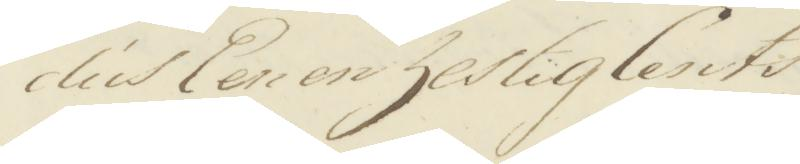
dus Een en Zestig Cents . . . . . „ — „ 61 „ 18„ 61
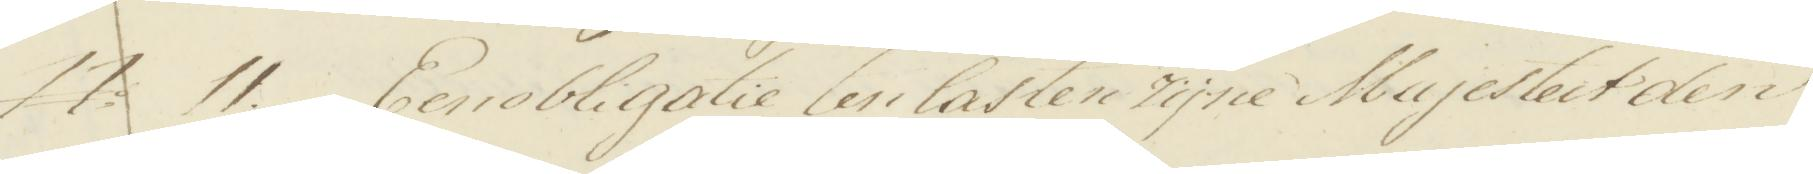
N.o 11. Een obligatie ten lasten zijne Majesteit den
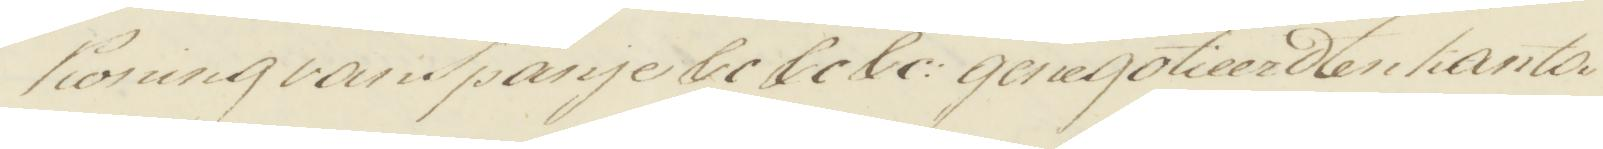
Koning van Spanje &c &c &c: genegotieerd ten kanto
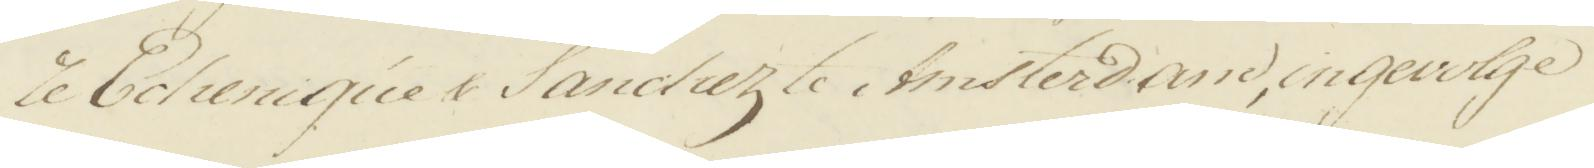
re Echenique & Sachez te Amsterdam, in gevolge
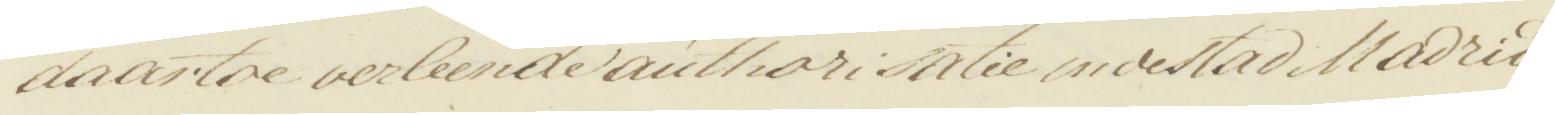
daartoe verleende authorisatie in de stad Madrid
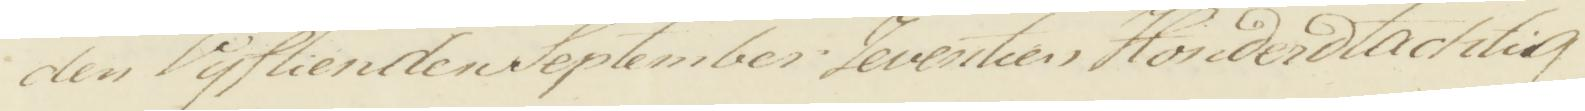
den Vijftienden September Zeventien Honderdtachtig
